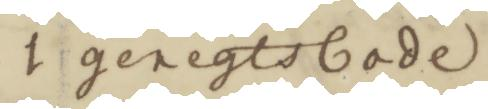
1 geregtsbode
